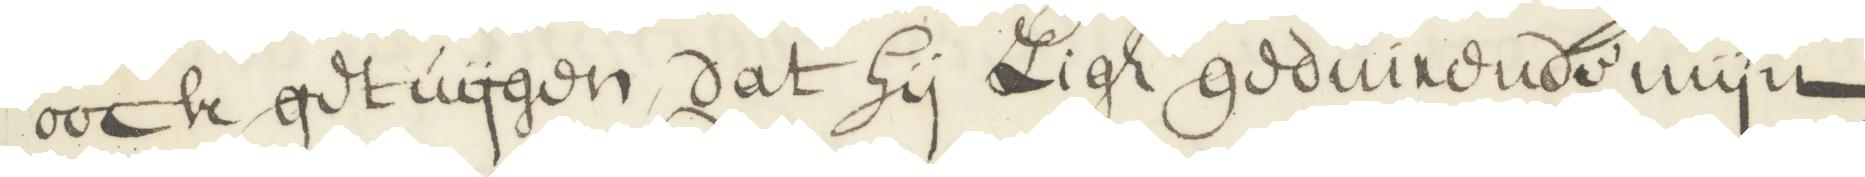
oock getuijgen, dat hij zigh geduirende mijn
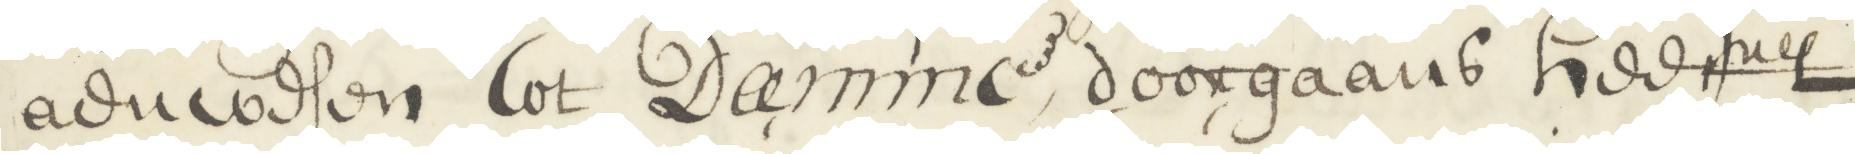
aenwesen tot Damme, doorgaans heeft
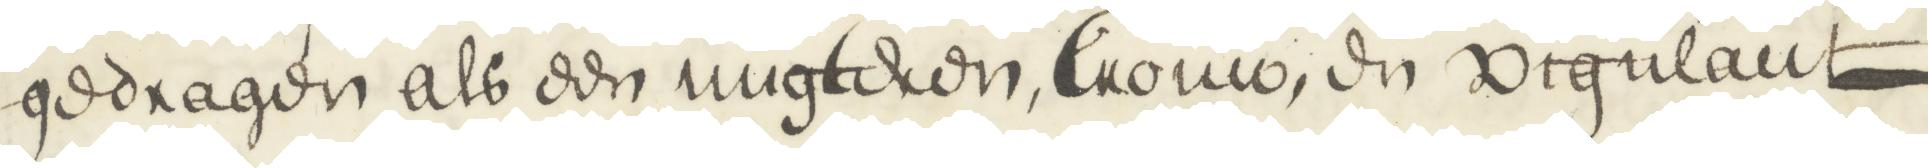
gedragen als een nugteren, trouw, en vigulant
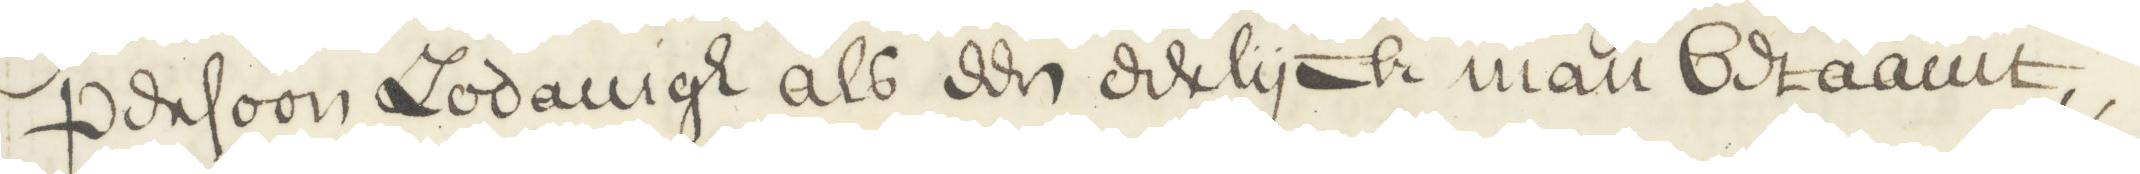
persoon zodanigh als een eerlijck man betaamt,
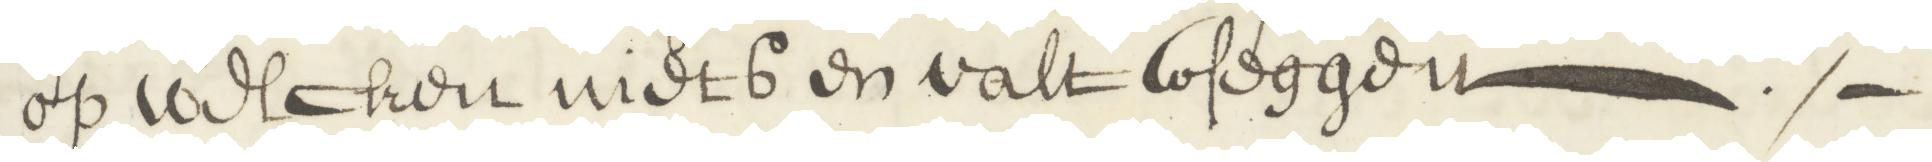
op welcken niets en valt teseggen. / —
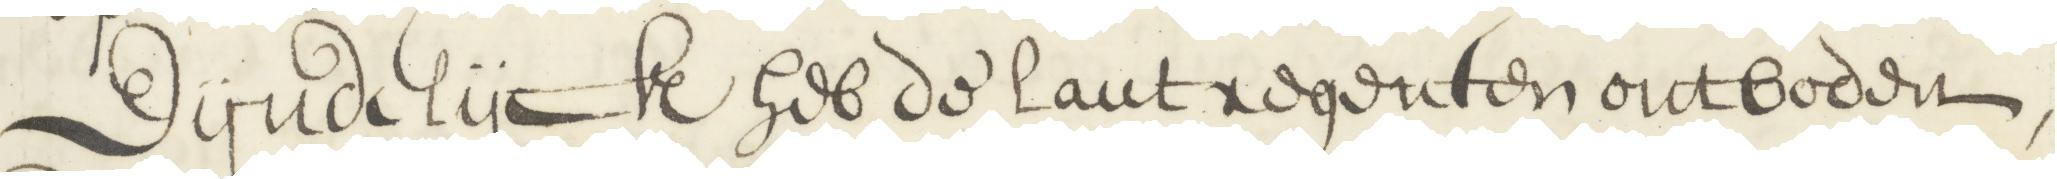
Eijndelijck heb de lant regenten ontboden,
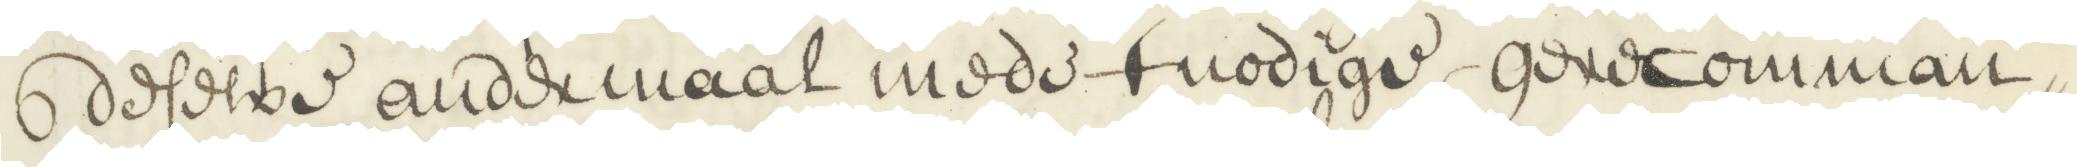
deselve andermaal mede t nodige gerecomman„
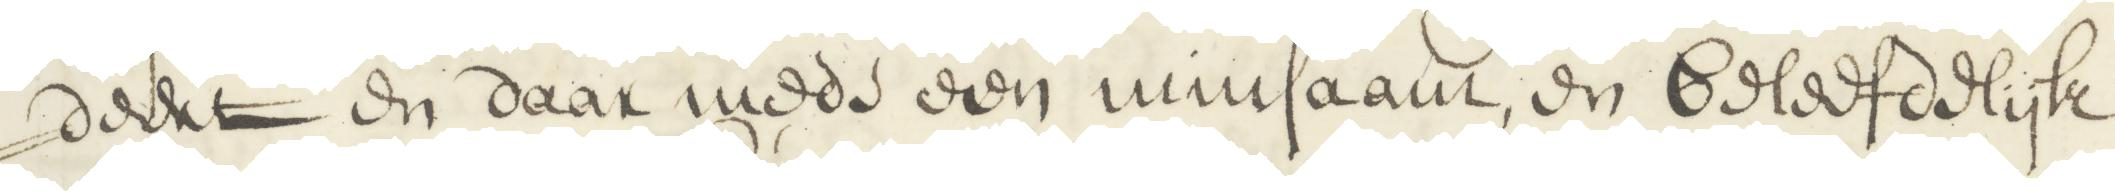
„deert en daar mede een minsaam, en beleefdelijk
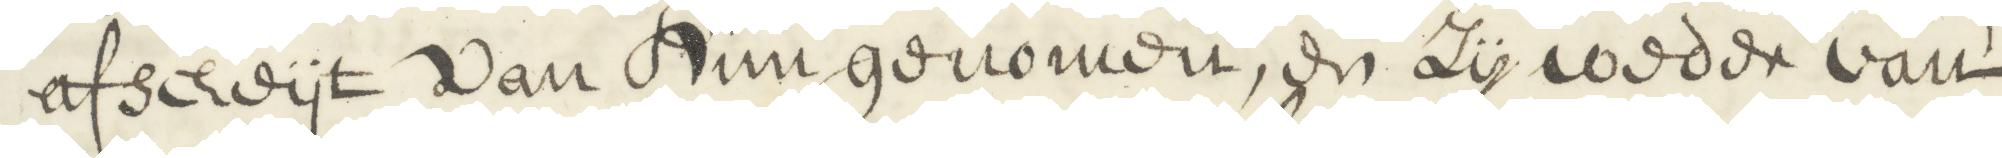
afscheijt van hun genomen, en zij weder van
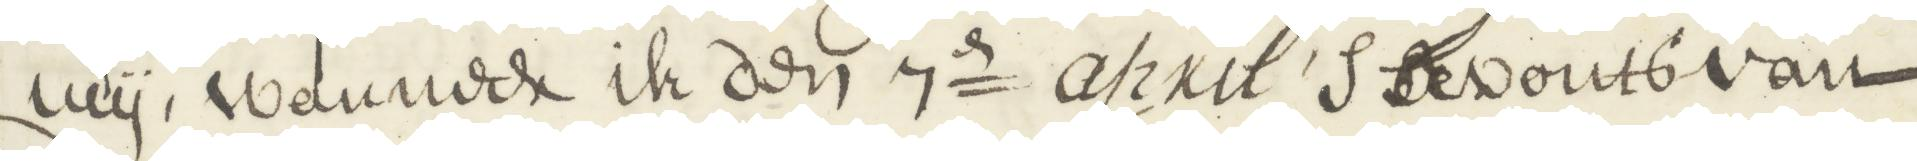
mij, wanneer ik den 7=en april 's avonts van
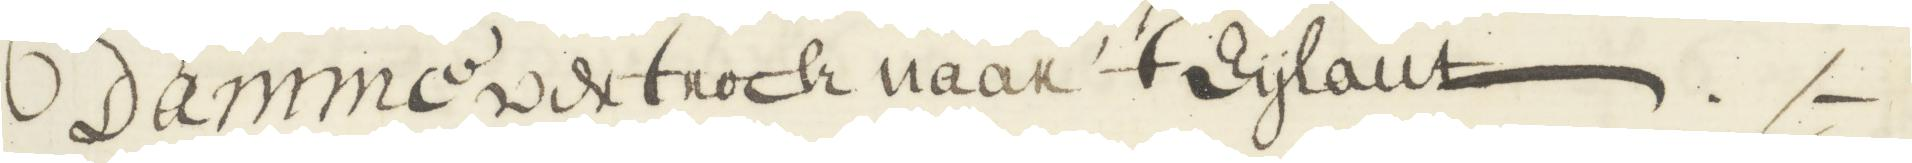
Damme vertrock naar ’t Eijlant. / —
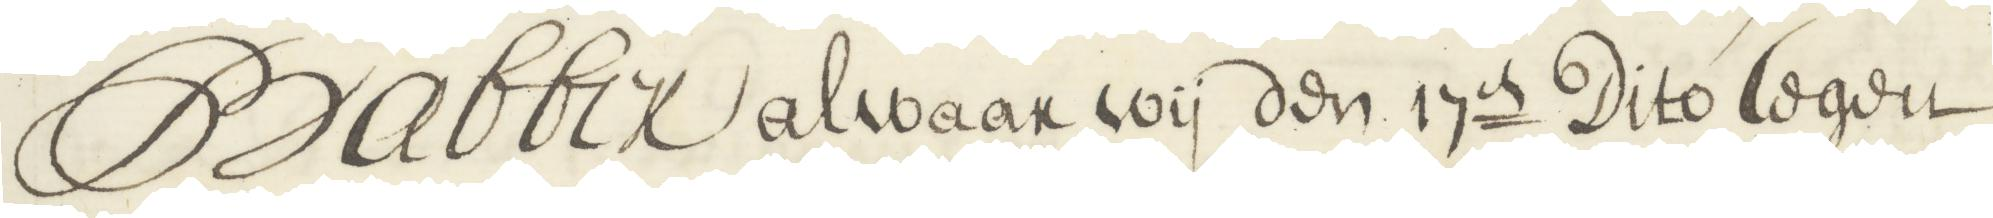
Babbir alwaar wij den 17=en Dito tegen
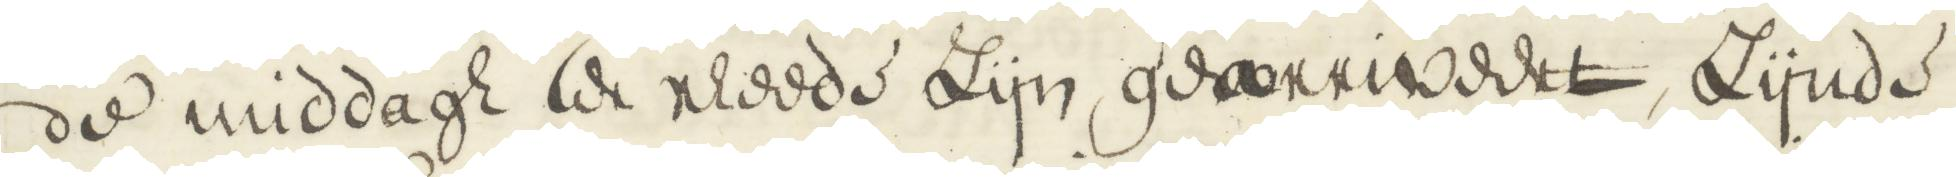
de middagh ter rheede zijn gearriveert, zijnde
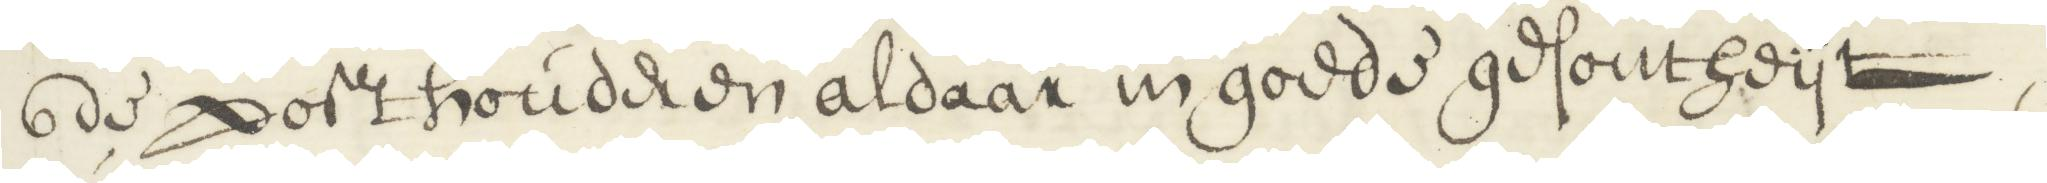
de posthouderen aldaar in goede gesontheijt,
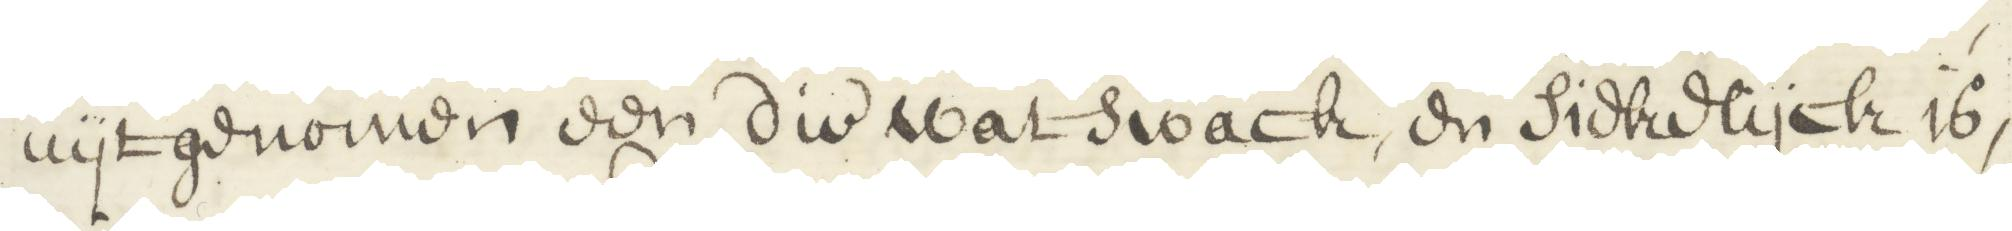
uijtgenomen een die wat swack, en siekelijck is,
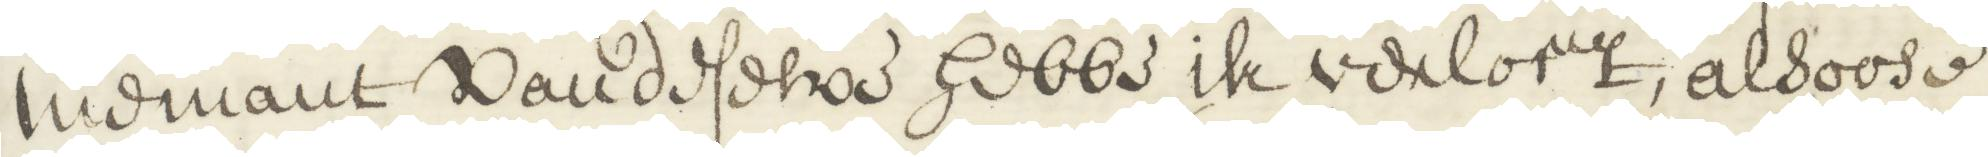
niemant van deselve hebbe ik verlost, alsoose
